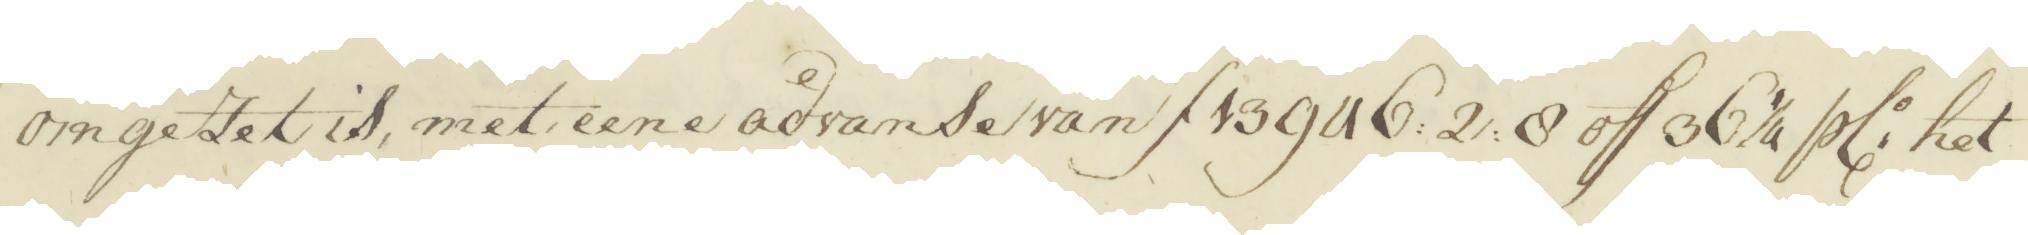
omgezet is, met eene advanse van ƒ13946:2:8 off 36¼ pC„o het
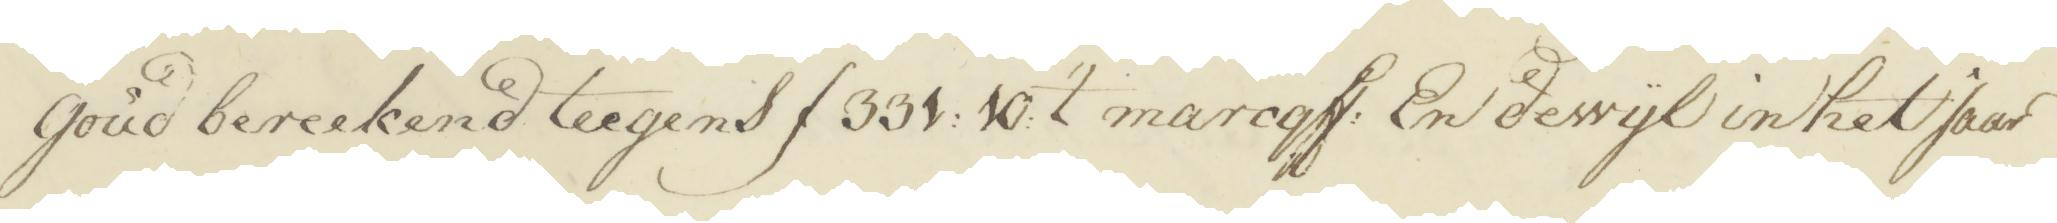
goud bereekend teegens ƒ331:10: ’t marcqff: En dewijl in het jaar
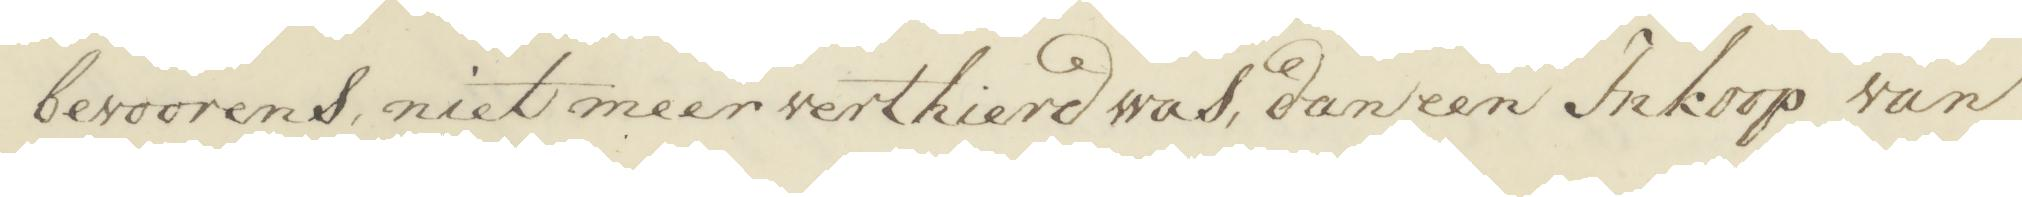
bevoorens, niet meer verthierd was, dan een Inkoop van
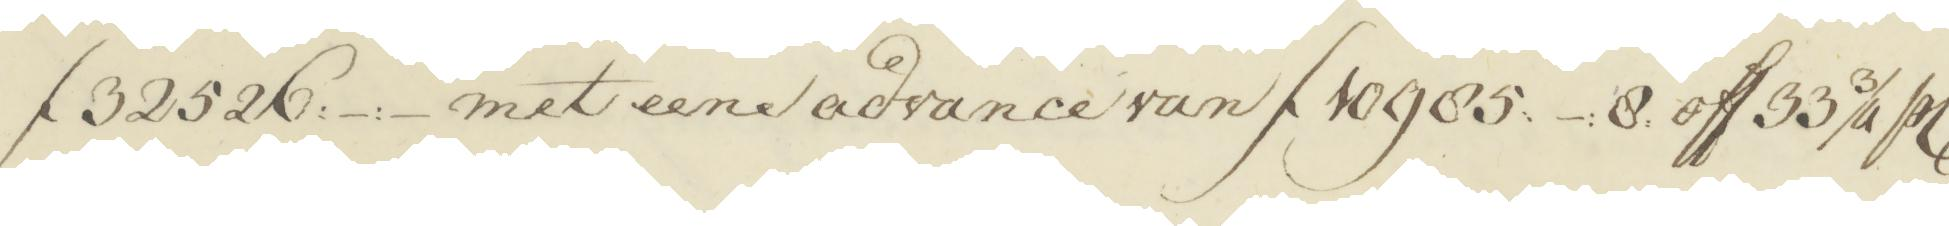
ƒ32526:–:– met eene advance van ƒ10985:–:8: off 33¾ pc
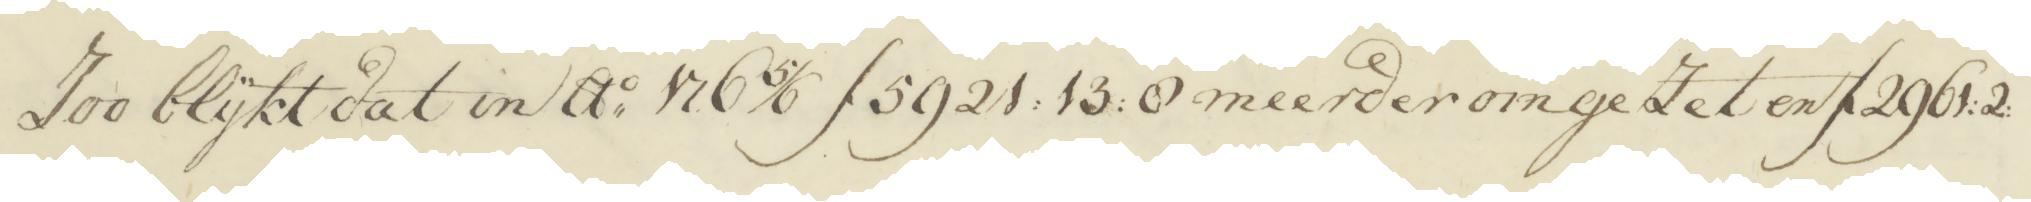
zoo blijkt dat in A„o 176 5/6 ƒ5921:13:8 meerder omgezet en ƒ2961:2:
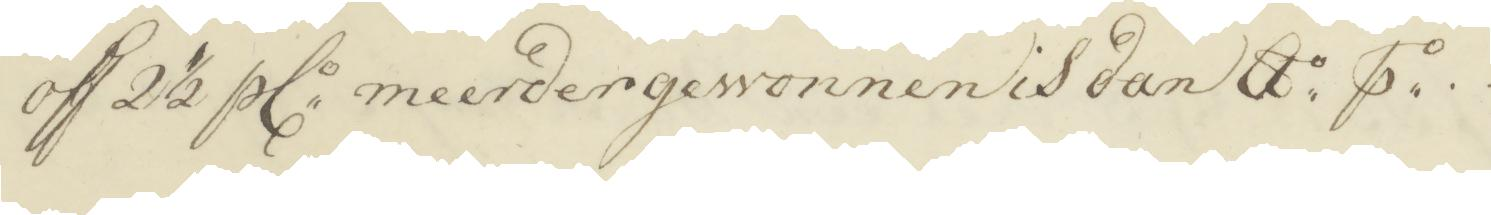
off 2½ pC„o meerder gewonnen is dan A„o pc„o.
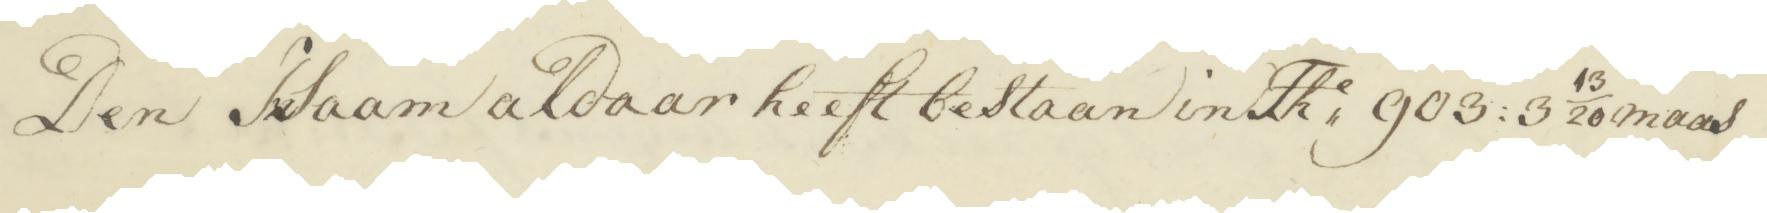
Den Insaam aldaar heeft bestaan in Th„e 903:3 13/20 maas
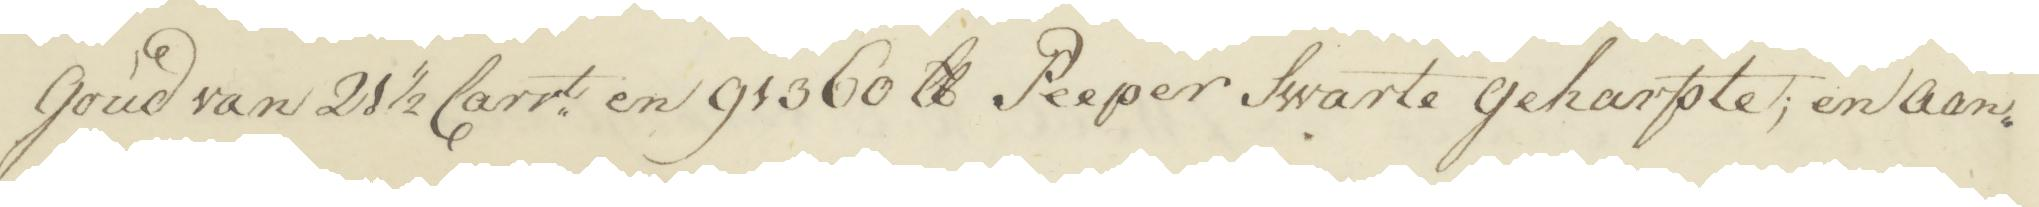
goud van 21½ Carr:t en 91360 lb Peeper swarte geharpte; en aan„
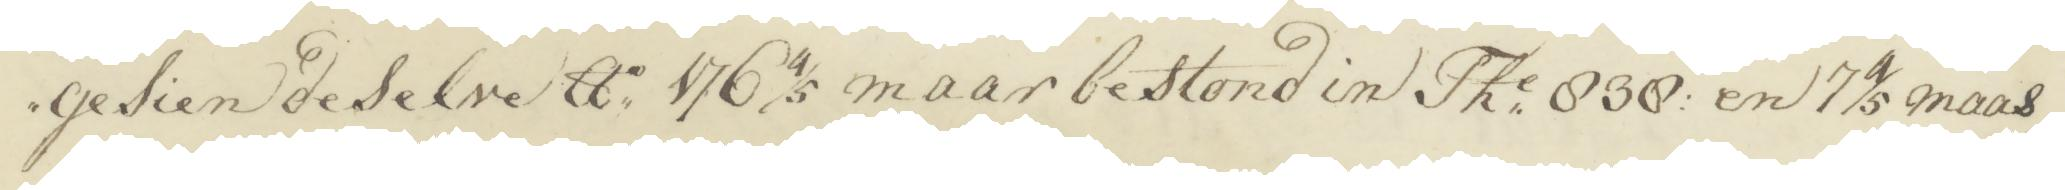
„gesien deselve A:o 176 4/5 maar bestond in Th„e 838: en 7 4/5 maas
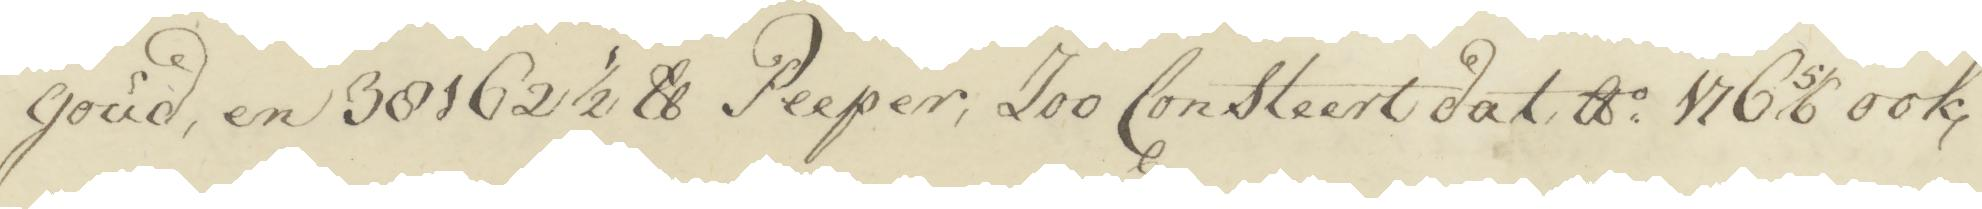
goud, en 38162½ lb Peeper, zoo Consteert dat A„o 176 5/6 ook,
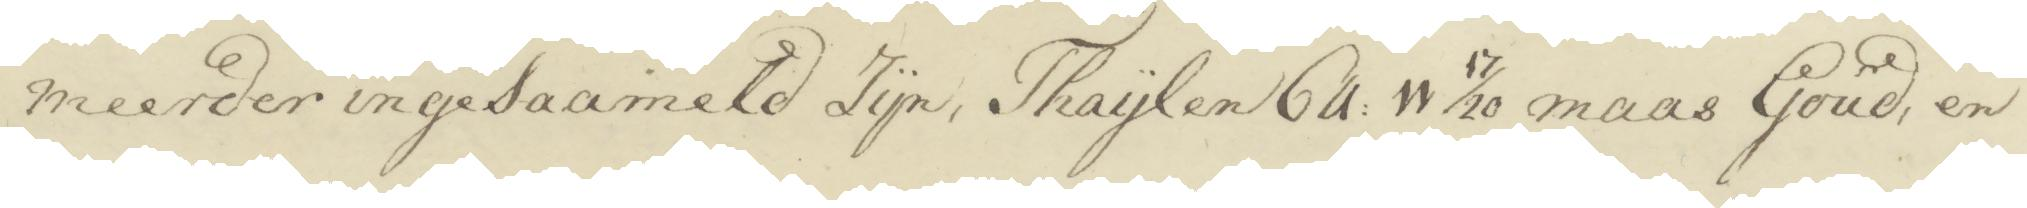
meerder ingesaameld zijn, Thaijlen 64: 11 17/20 maas Goud, en
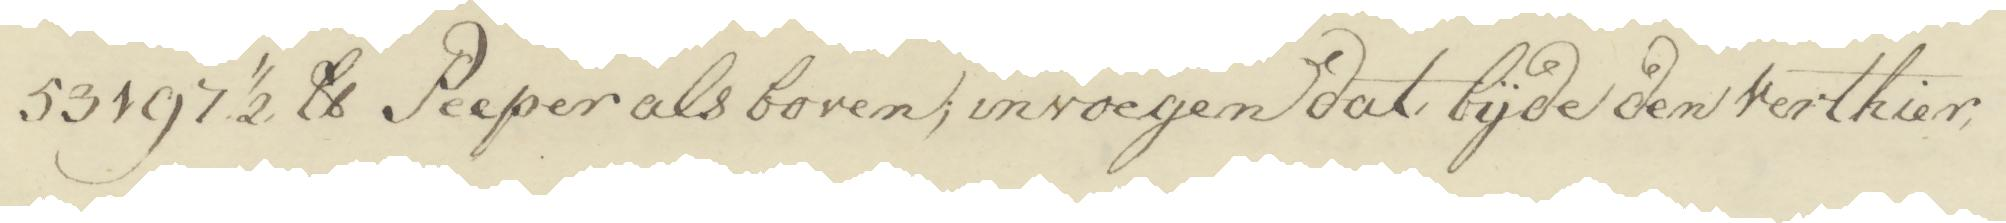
53197½ lb Peeper als boven; invoegen dat bijde den verthier,
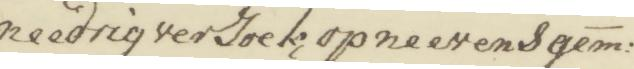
needrig verzoek, op neevens gem:
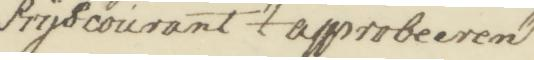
Prijscourant 't approbeeren
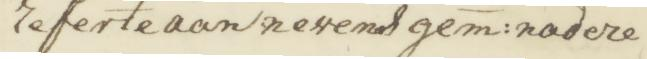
referte aan nevens gem: nadere
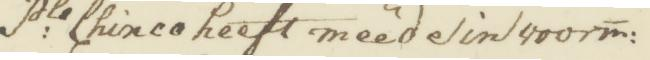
P:lo Chinco heeft meede in voorm:
